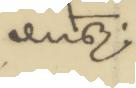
ensz:
